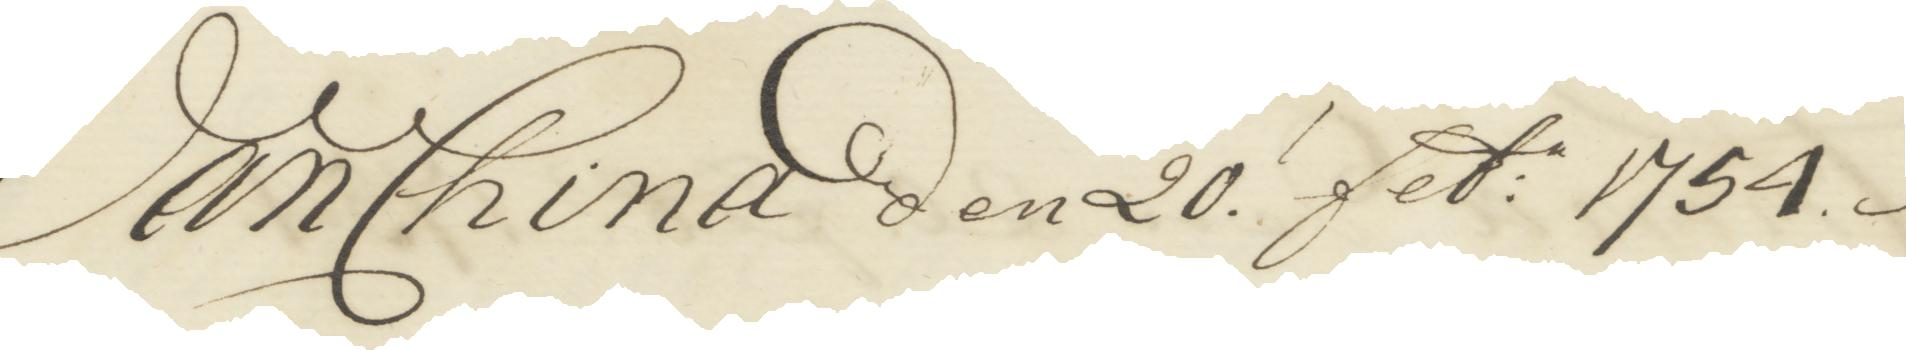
Van China den 20.' feb:r 1754.
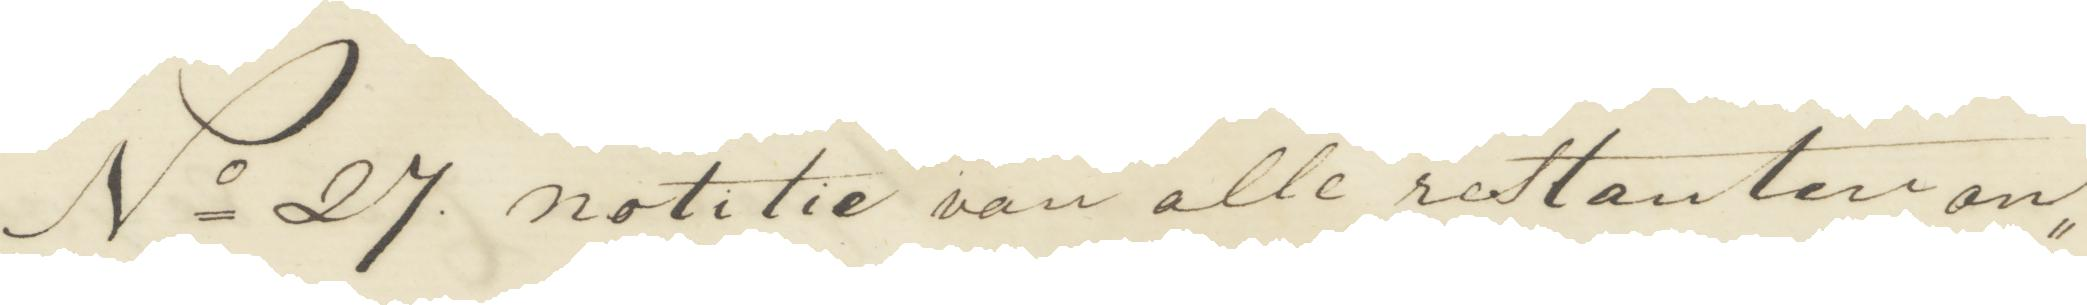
N=o 27. notitie van alle restanten on„
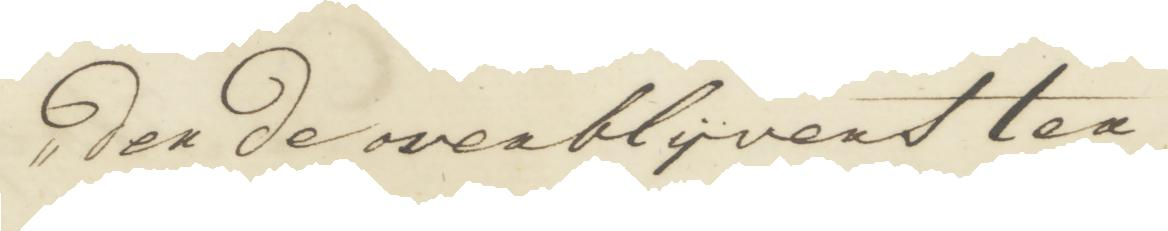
„der de overblijvers ter
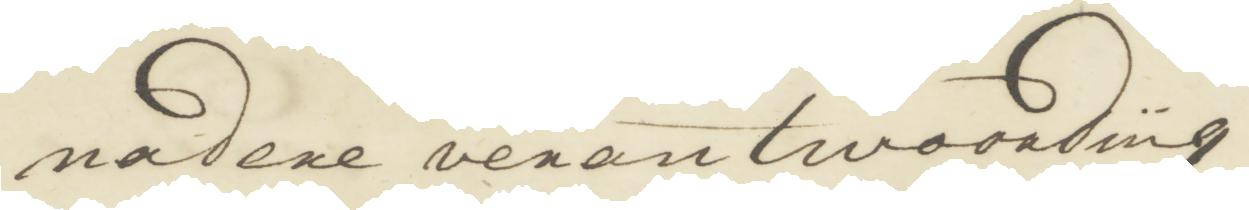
nadere verantwoording
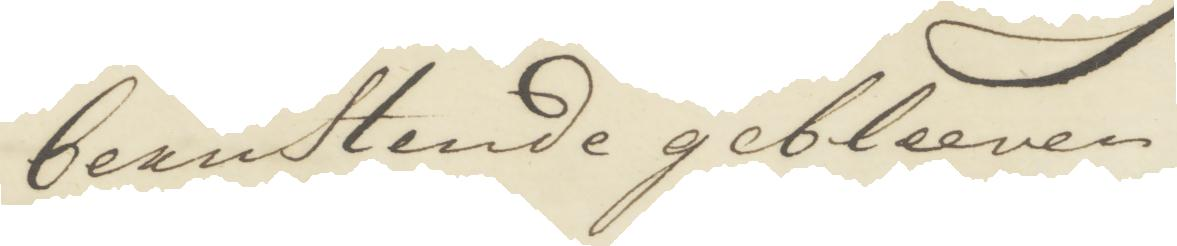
berustende gebleeven
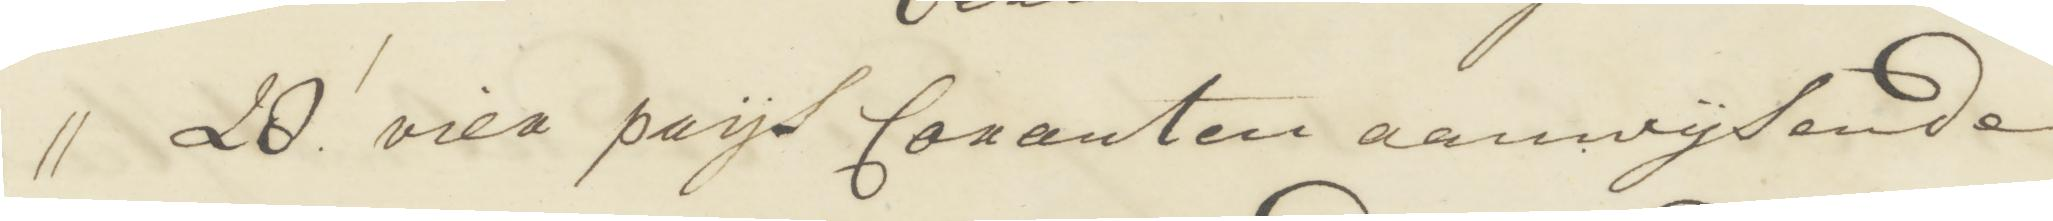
„ 28.' vier paijs Coranten aanwijsende
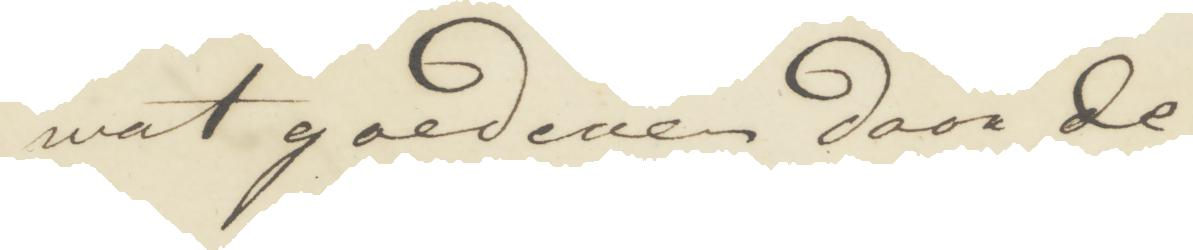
wat goederen door de
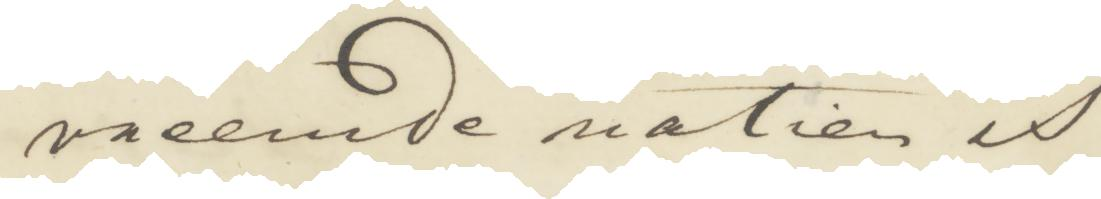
vreemde natien is
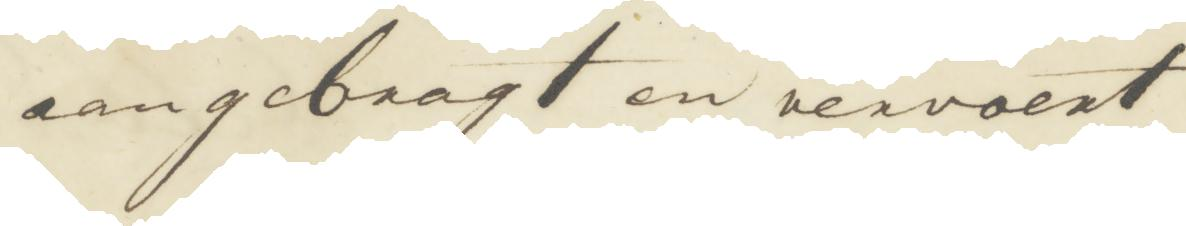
aangebragt en vervoert
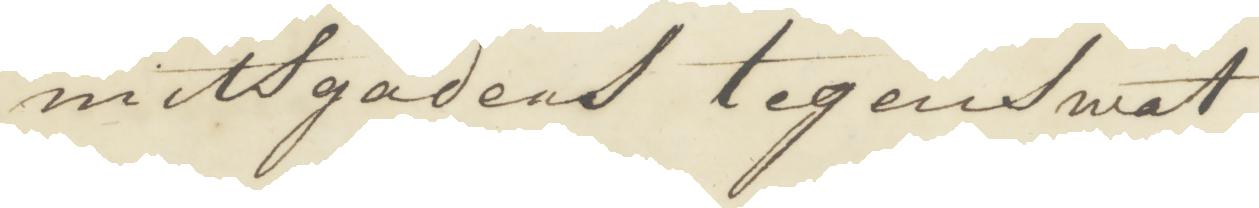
mitsgaders tegens wat
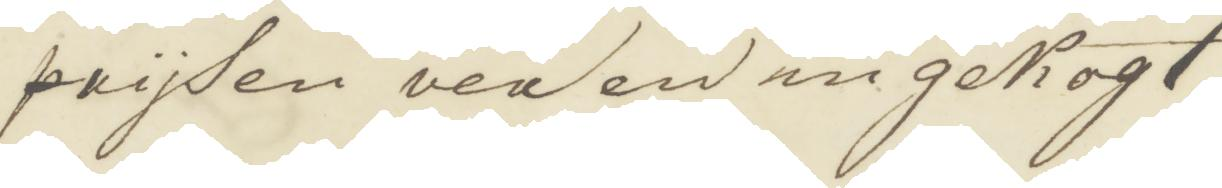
prijsen ver en ingekogt
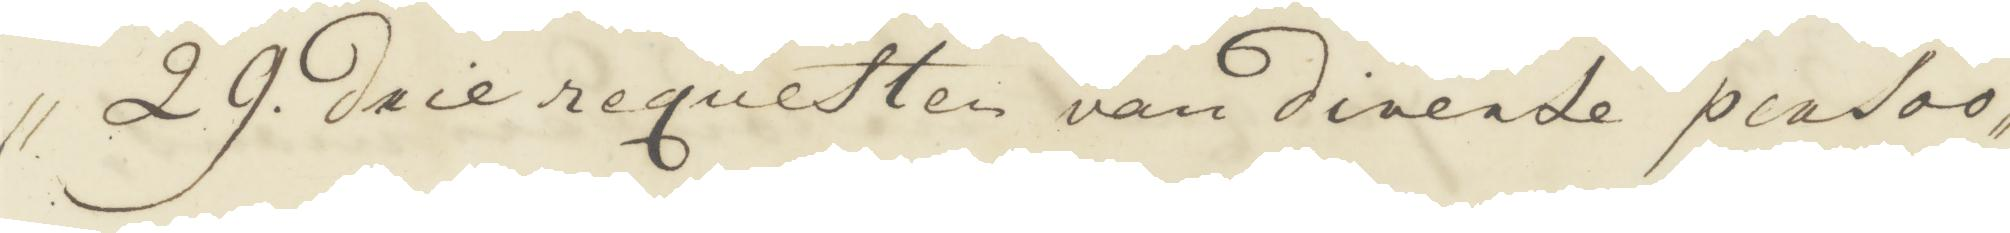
„ 29. drie requesten van diverse persoo„
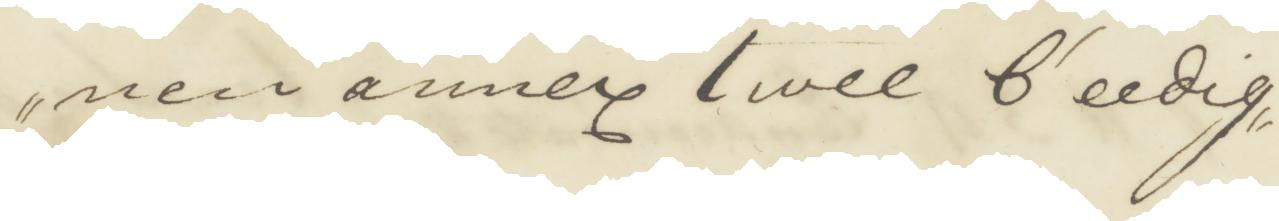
„nen annex twee b'eedig„
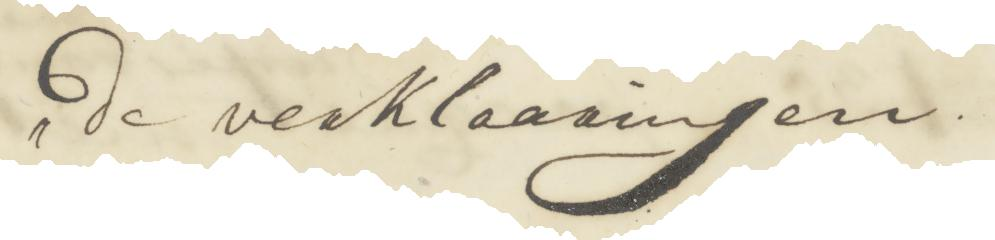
„de verklaaringen.
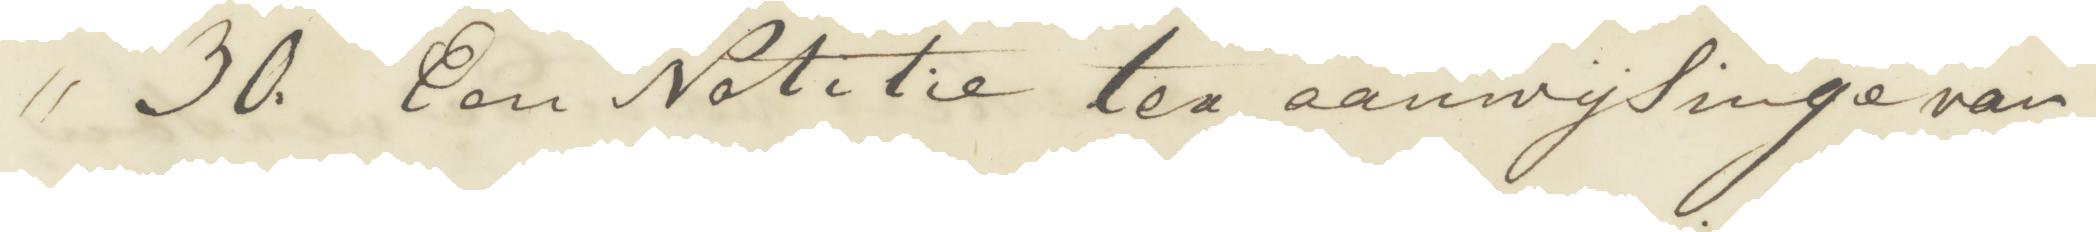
„ 30. Ean Notitie ter aanwijsinge van
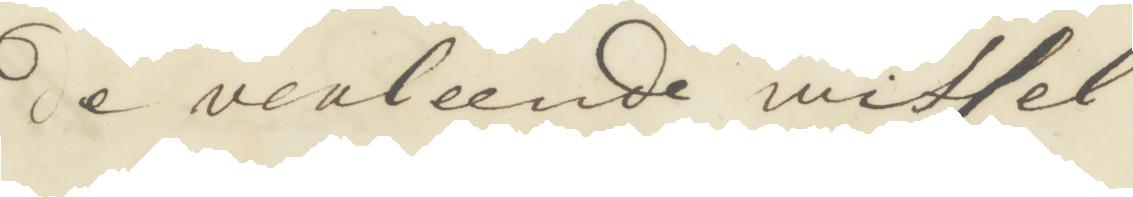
de verleende wissel
